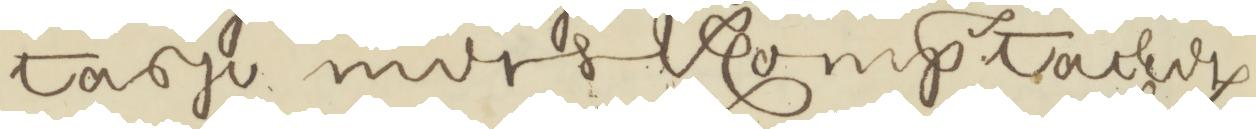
casje met s EComps cachet
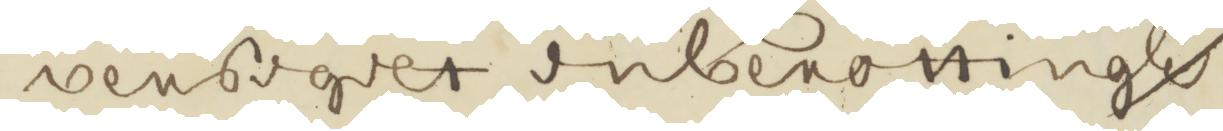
versegelt en berottingh
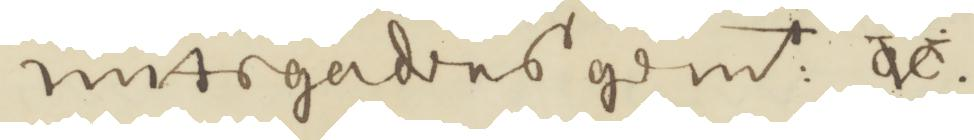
mitsgaders gem:t .
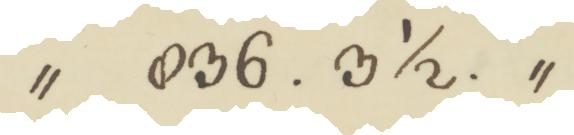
„ 836. 3½. „
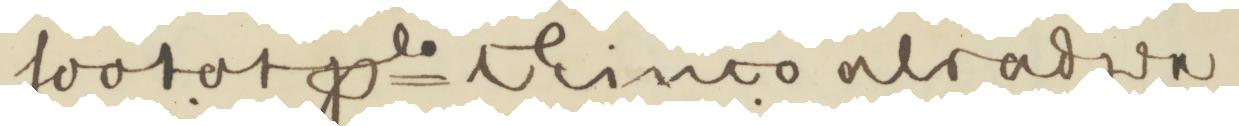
soo tot p=lo chinco als adjer
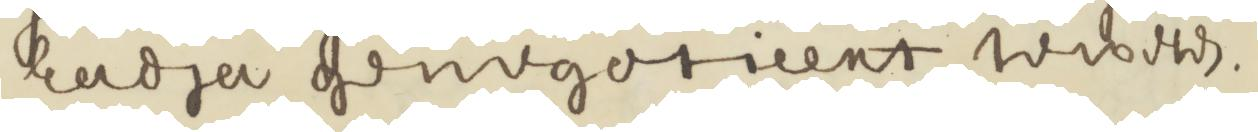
hadja genegotieert te weten.
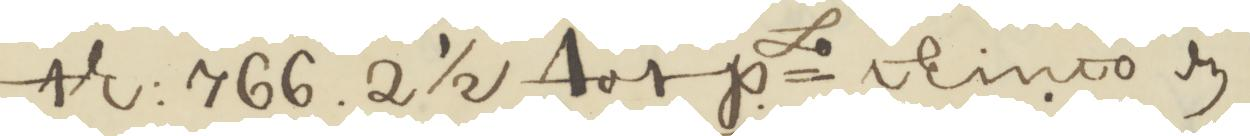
th: 766. 2½ tot p=lo chinco en
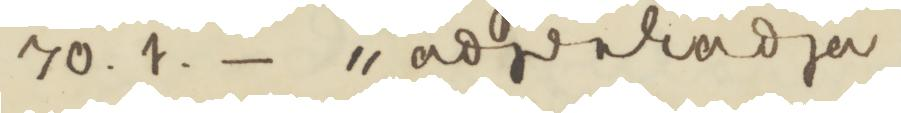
70. 1. — „ adjerhadja
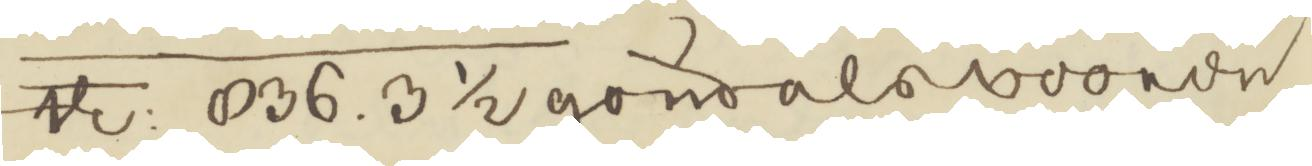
th: 836. 3½ goud als vooren
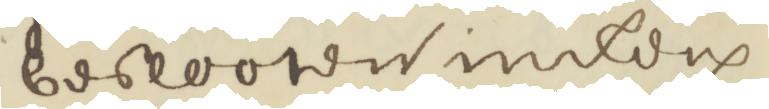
beslooten in Een
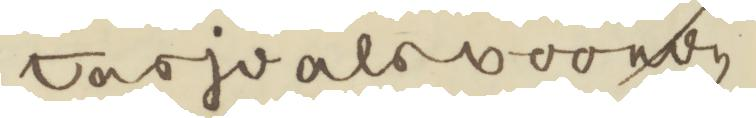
casje als vooren
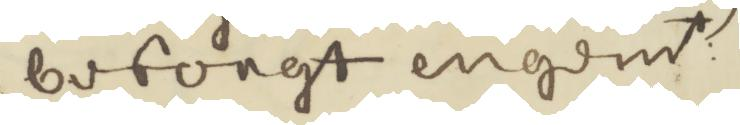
besorgt en gem:t
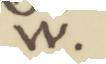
w.
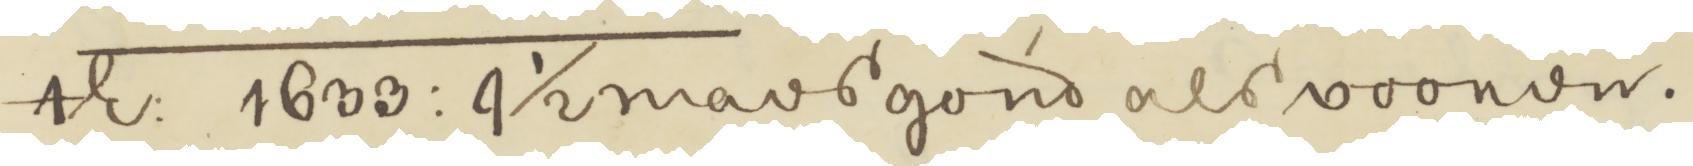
th: 1633: 4½ maes goud als vooren.
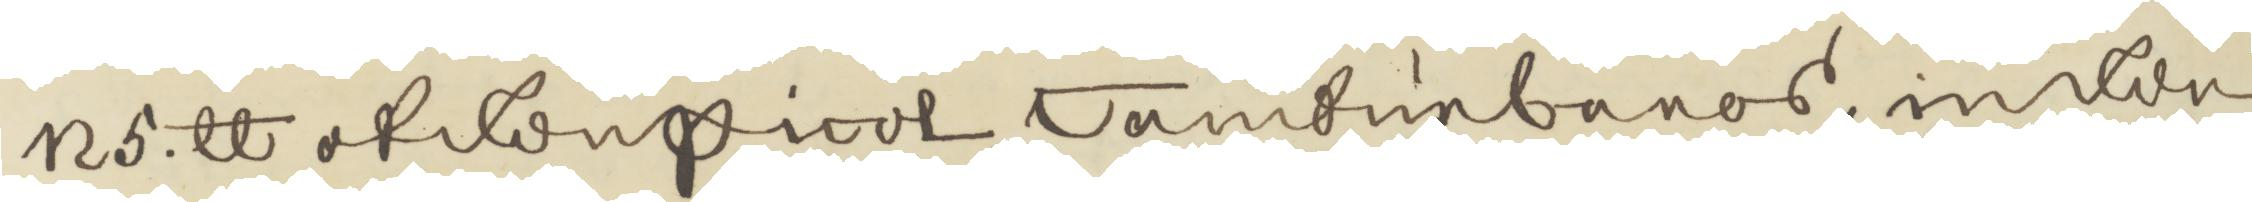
125. lb of Een picol Camfurbaros in Een
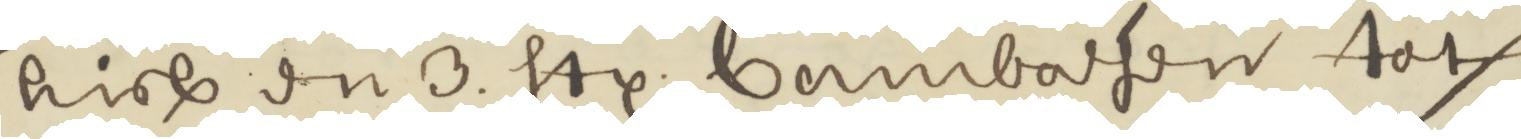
kist en 3. stx: bamboesen tot
